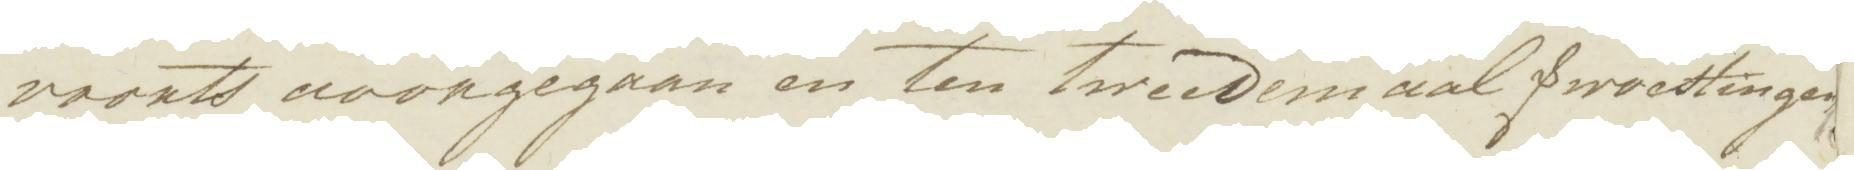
voorts doorgegaan en ten tweedemaal verwoestingen
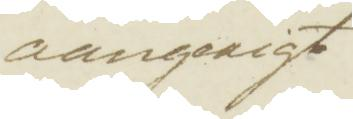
aangerigt
